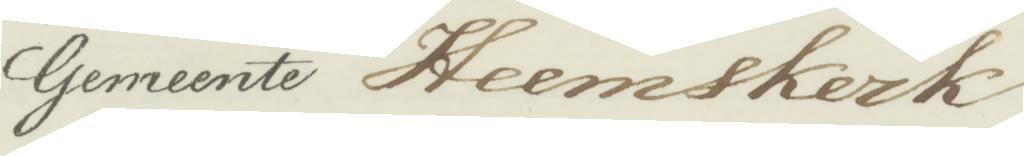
Gemeente Heemskerk
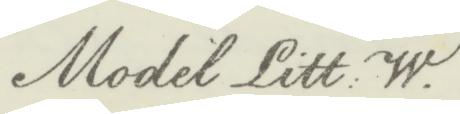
Model Litt: W.
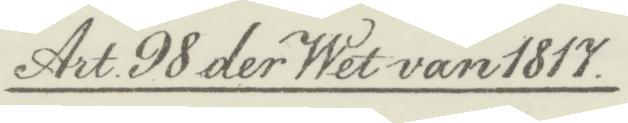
Art: 98 der Wet van 1817.
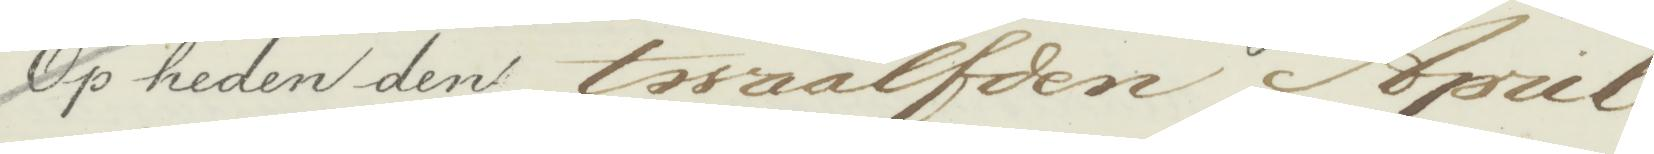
Op heden den twaalfden April
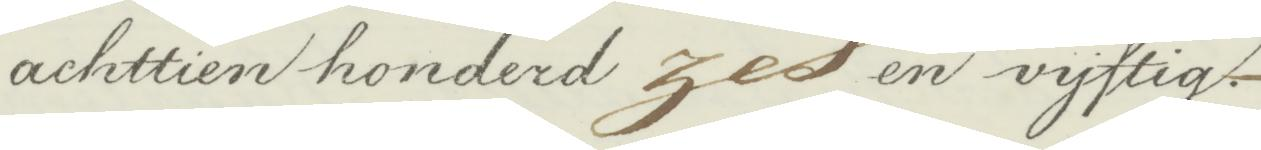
achttien honderd zes en vijftig.-
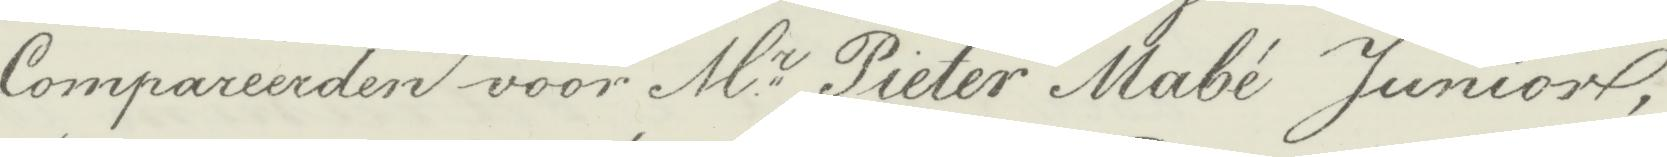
Compareerden voor M.„r Pieter Mabé Junior,
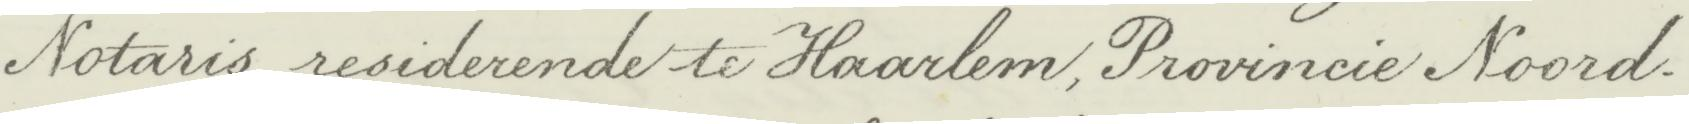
Notaris residerende te Haarlem, Provincie Noord-
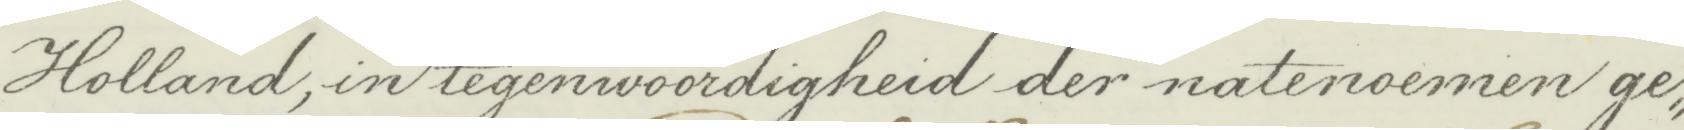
Holland, in tegenwoordigheid der natenoemen ge
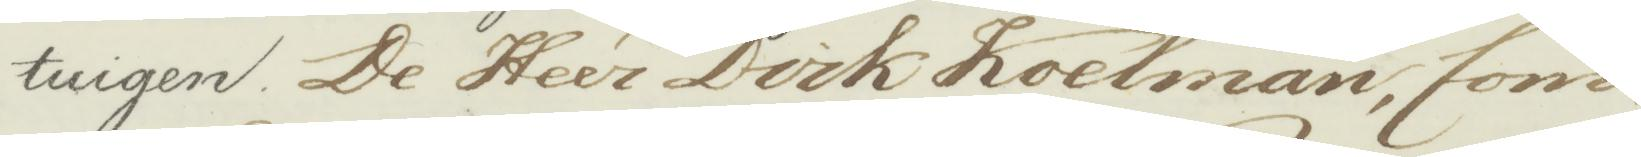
tuigen. De Heer Dirk Koelman, Com
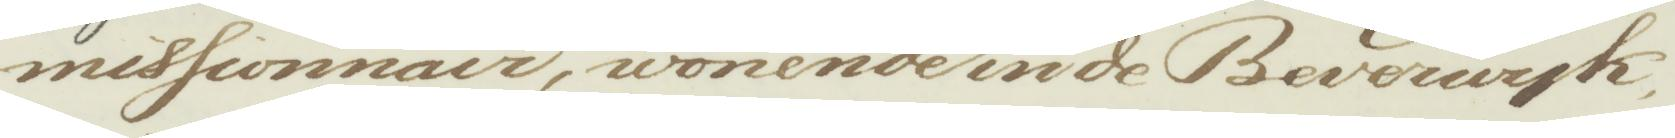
missionnair, wonende in de Beverwyk,
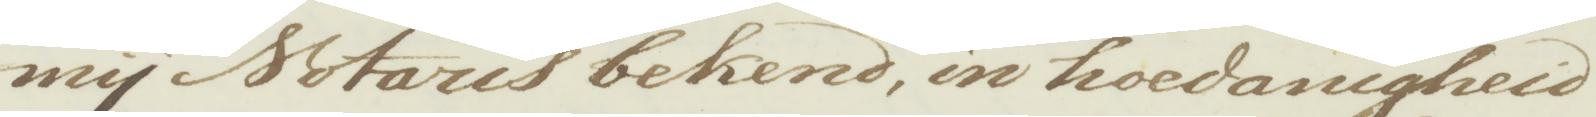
mij Notaris bekend, in hoedanigheid
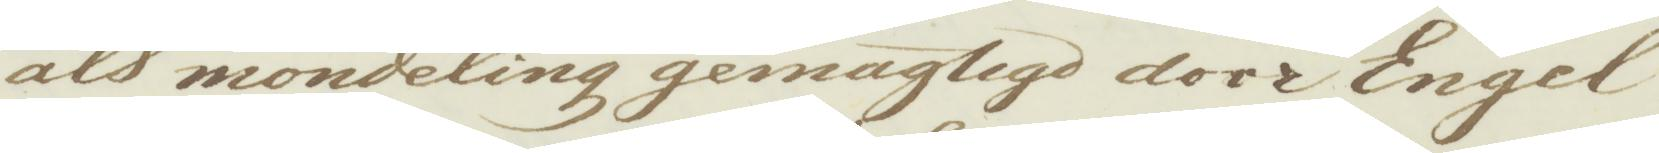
als mondeling gemagtigd door Engel
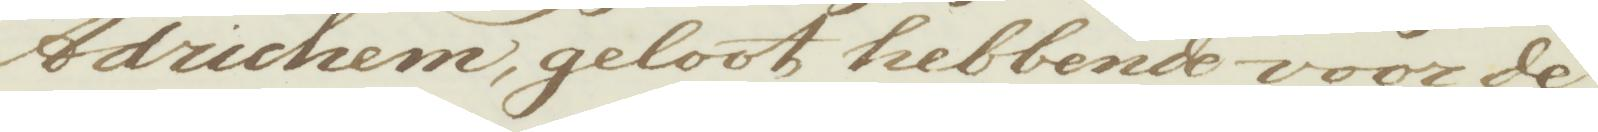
Adrichem, geloot hebbende voor de
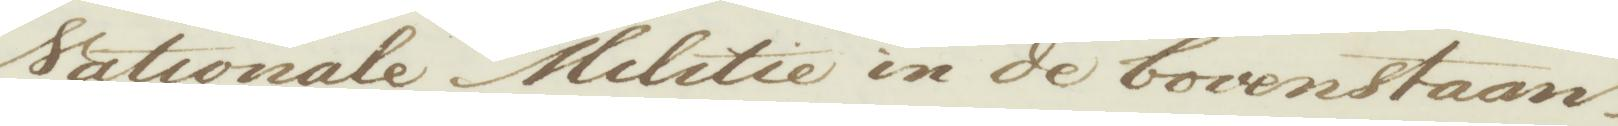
Nationale Militie in de bovenstaan-
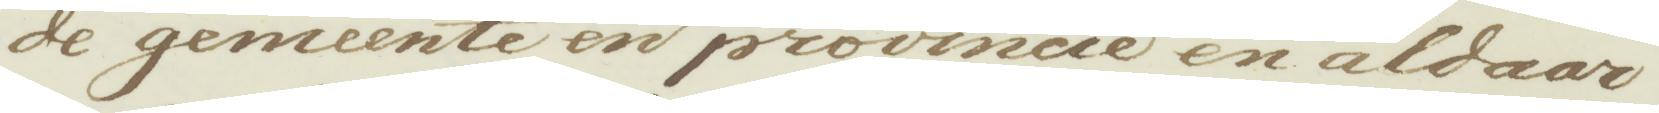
de gemeente en provincie en aldaar
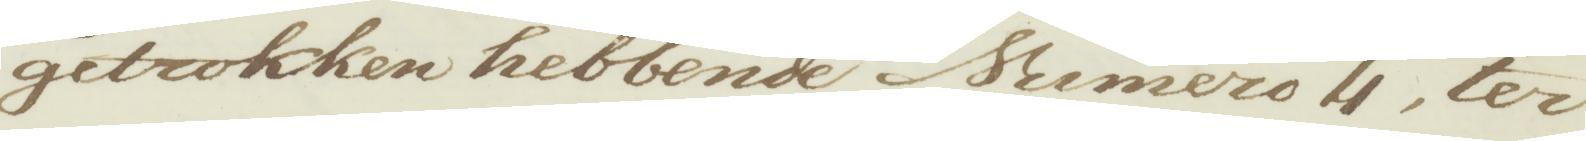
getrokken hebbende Numero 4, ter
